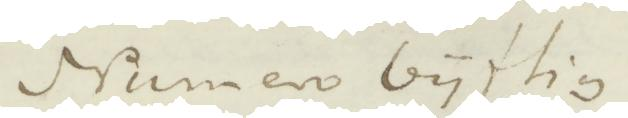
Numero Vijftig
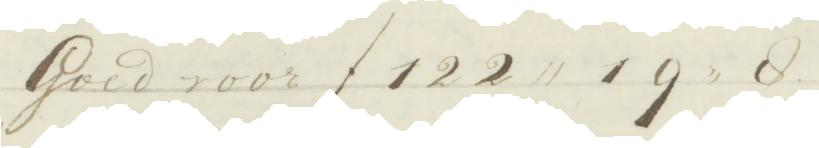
Goed voor ƒ 122„ 19„ 8.
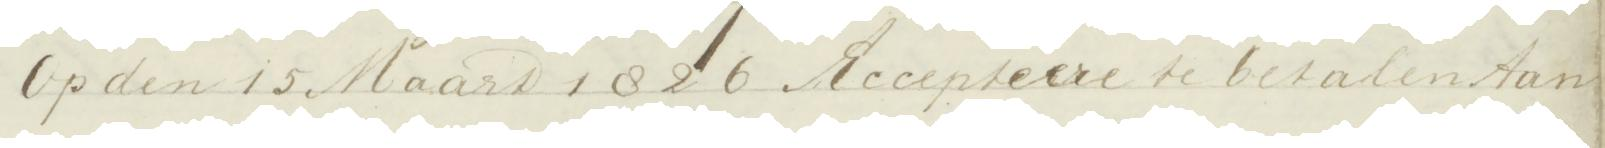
Op den 15 Maart 1826 Accepteere te betalen Aan
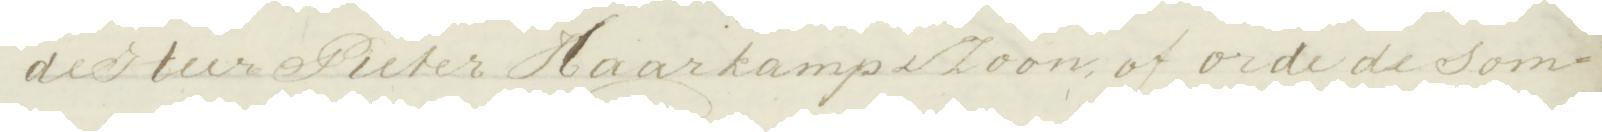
de Heer Pieter Haarkamp & zoon, of orde de som=
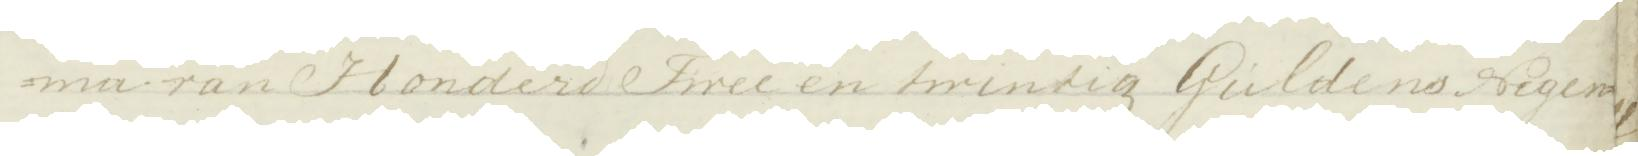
=ma van Honderd Twee en twintig Guldens Negen
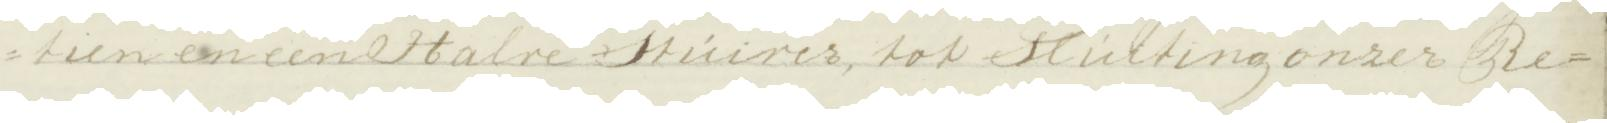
=tien en een Halve stuiver tot sluiting onzer Re=
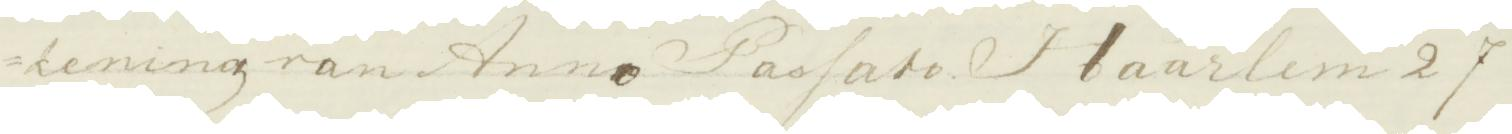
=kening van Anno Passato Haarlem 27
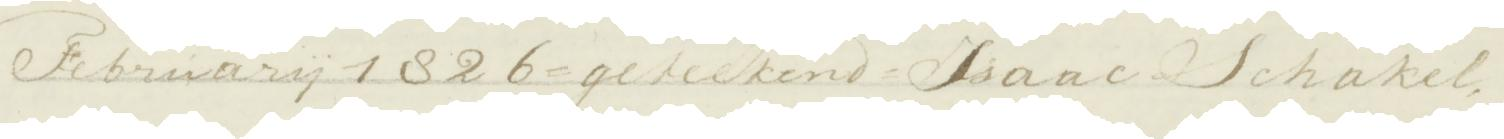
Februarij 1826= geteekend Isaac Schakel,
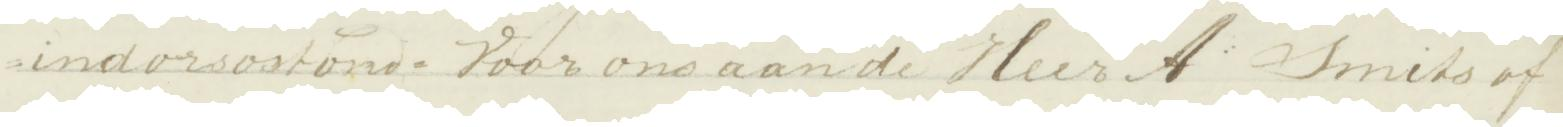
indorso stond Voor ons aan de Heer A Smits of
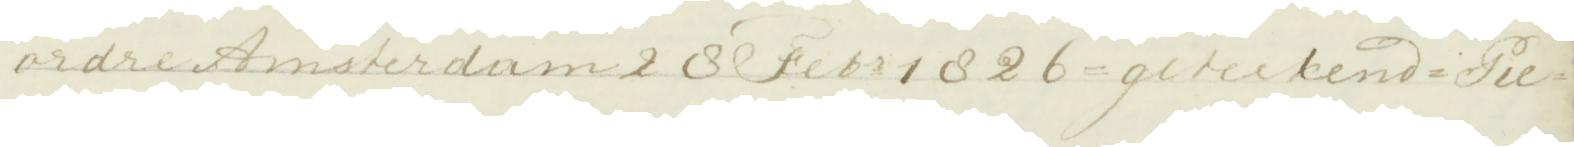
ordre Amsterdam 28 febr 1826= geteekend= Pie=
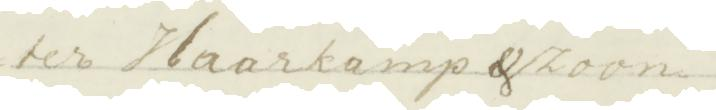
=ter Haarkamp & zoon
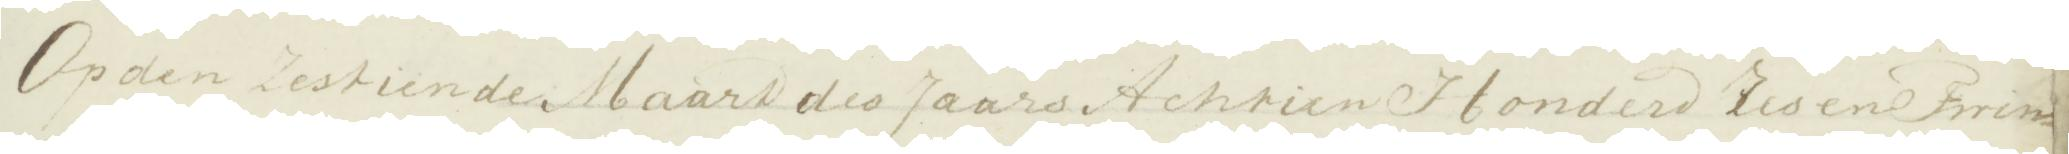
Op den Zestiende Maart des jaars Achtien Honderd Zes en Twin
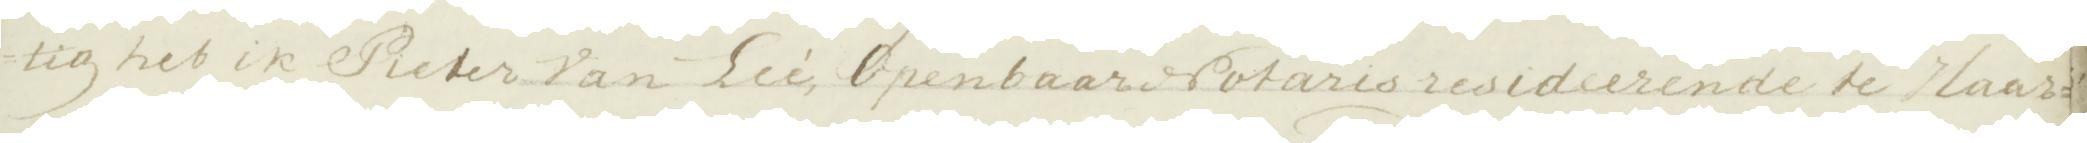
„tig heb ik Pieter Van Leé Openbaar Notaris resideerende te Haar=
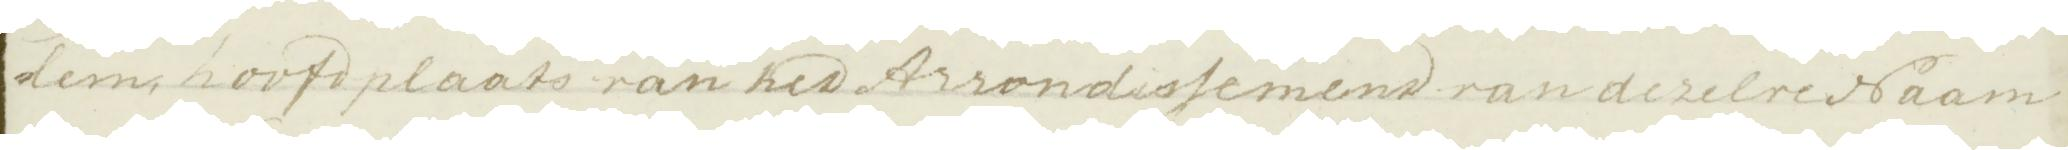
lem, hoofdplaats van het Arrondissemend van dezelve Naam
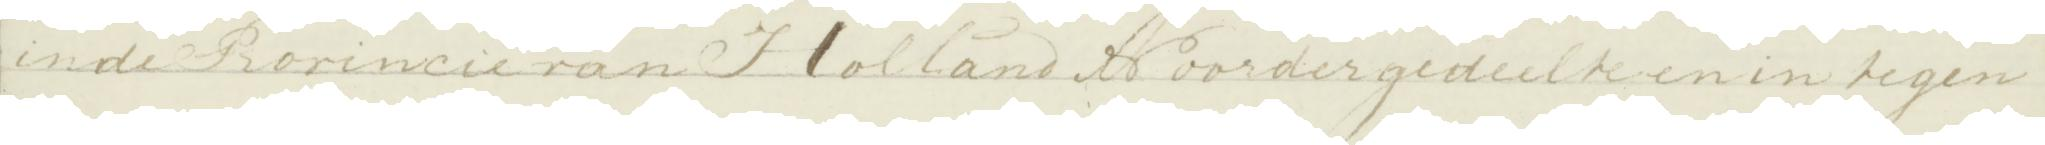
in de Provincie van Holland Noordergedeelte en in tegen
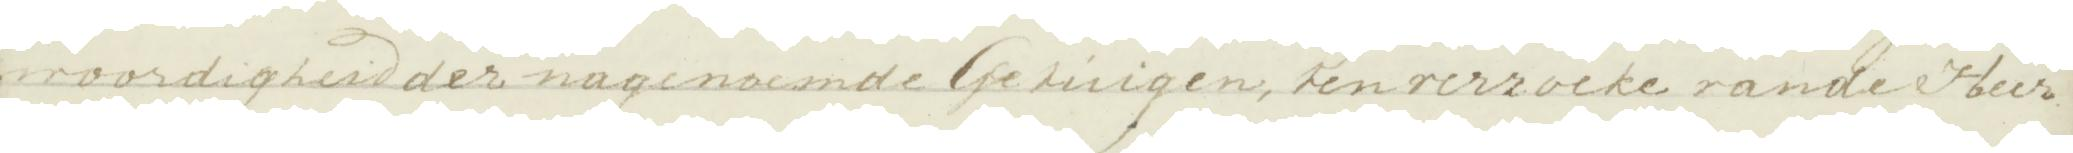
woordigheid der nagenoemde Getuigen, ten verzoeke van de Heer
